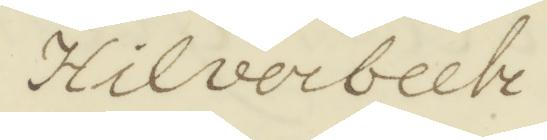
Hilverbeek
